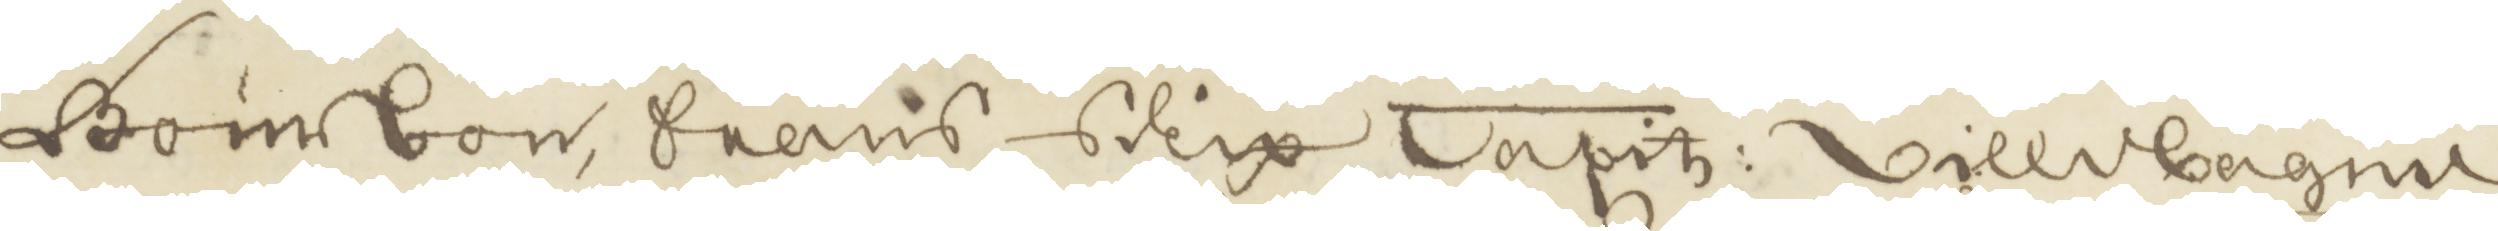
Bourbon, frans schip Capitn: villebague
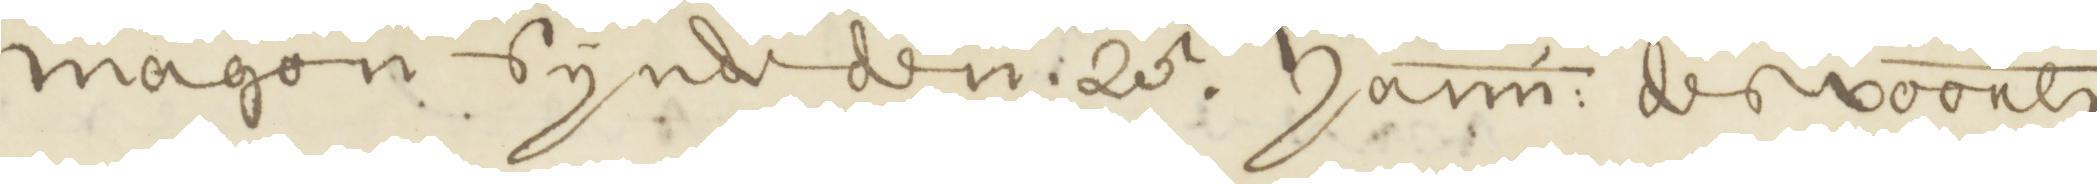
magon sijnde den 25. Janu: des voorl
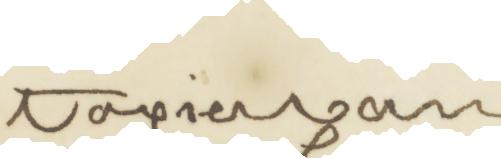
copie van
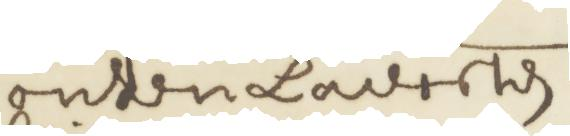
onsen Laetsten
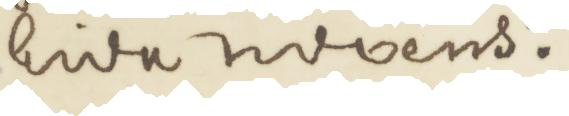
hier nevens.
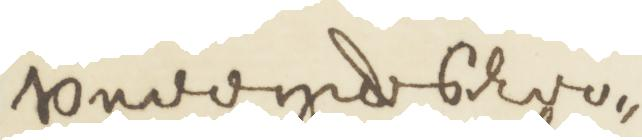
vreemde schee„
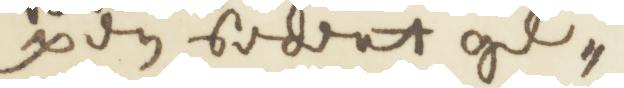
pen sedert ge„
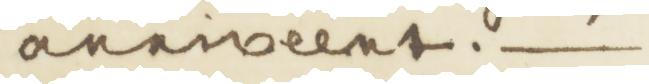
arriveert. —
